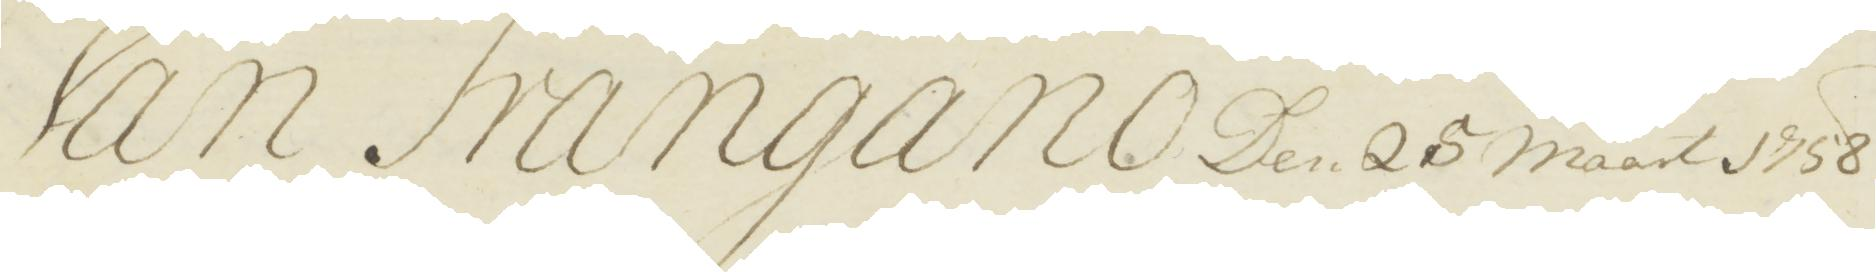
Van Trangano Den 25: maart 1758
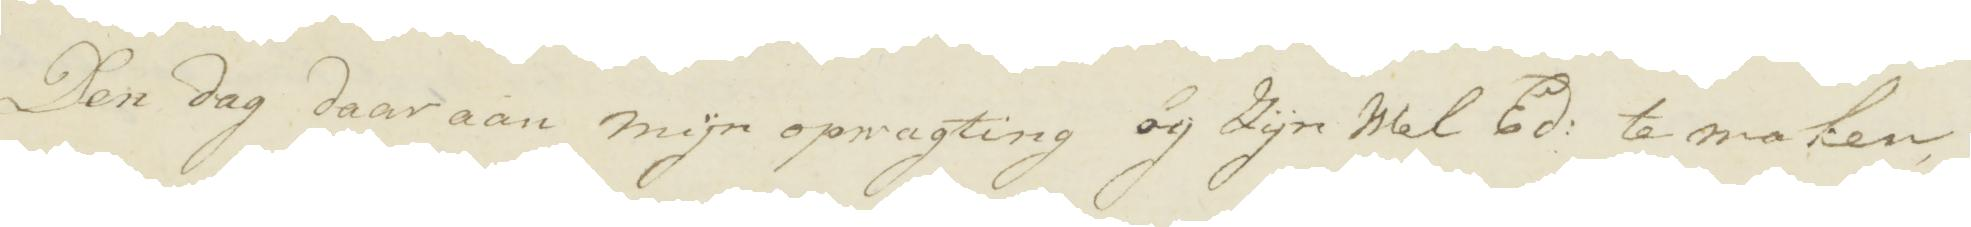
Den dag daar aan mijn opwagting bij zijn wel Ed: te maken,
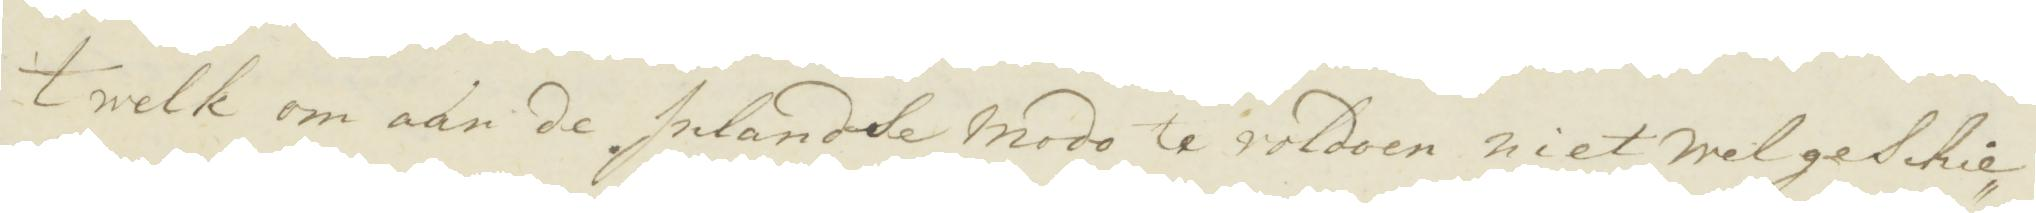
't welk om aan de jnlandse modo te voldoen niet wel geschie„
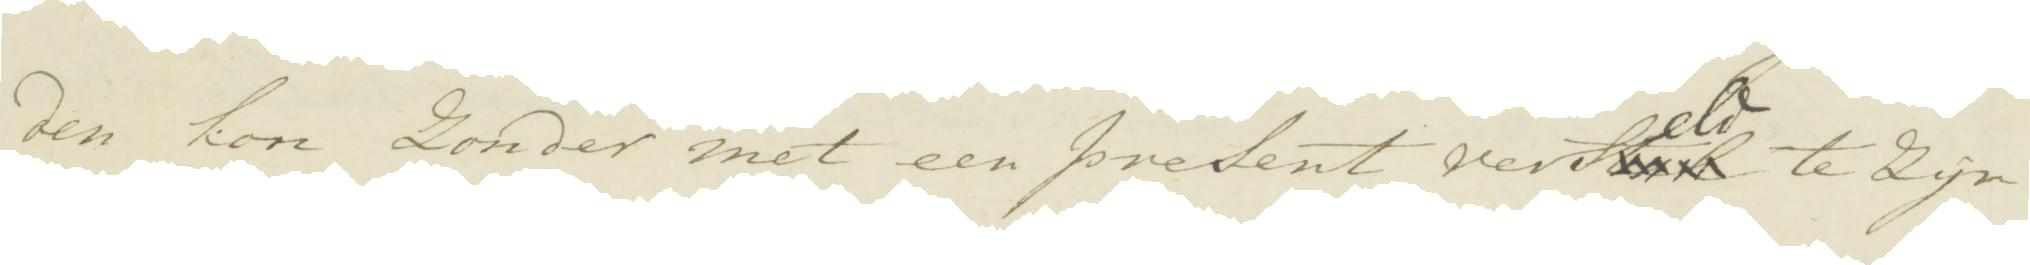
den kon zonder met een present verseheld te zijn
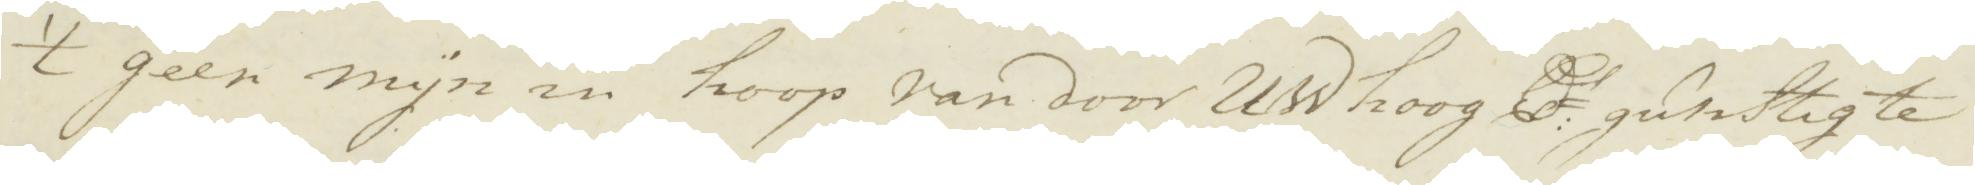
’t geen mijn in hoop van door Uw hoog Ed: gunstig te
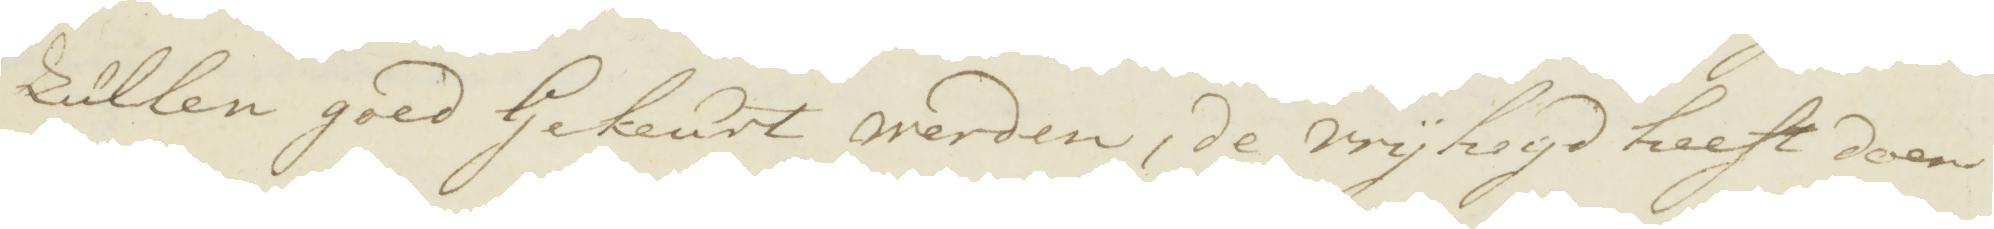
zullen goed gekeurt werden, de vrijheijd heeft doen
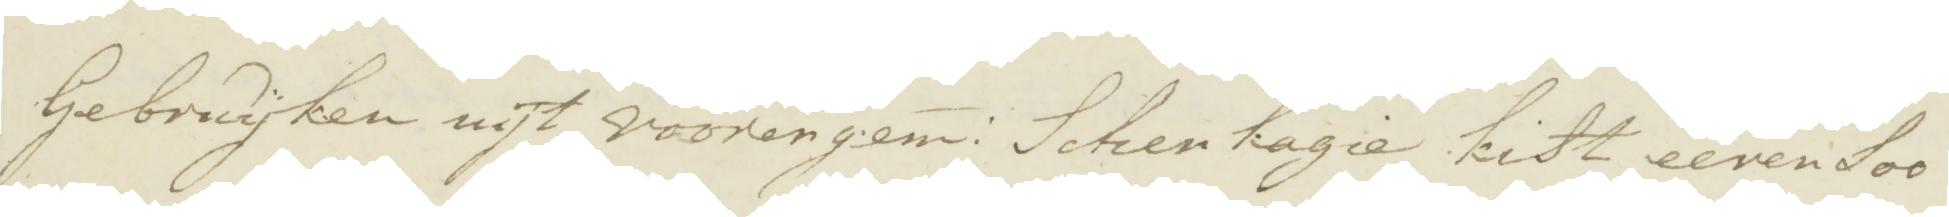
gebruijken uijt voorengem: schenkagie kist eeven soo
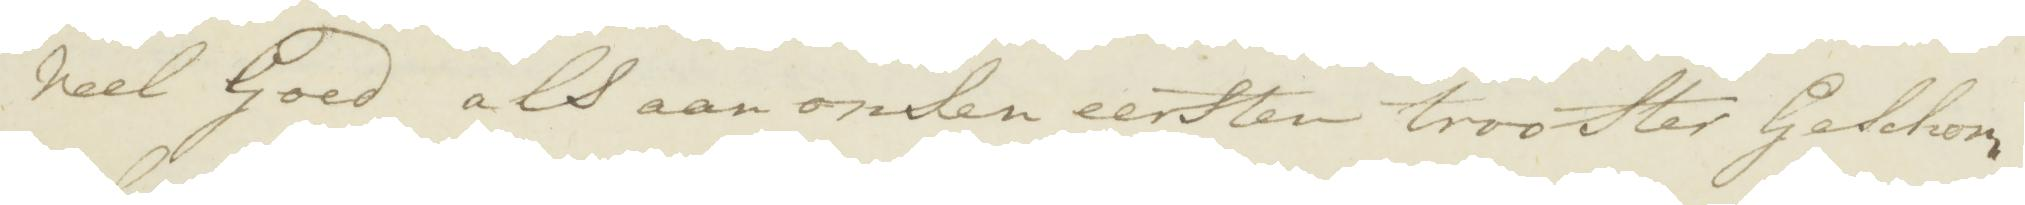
veel goed als aan onsen eersten trooster geschon„
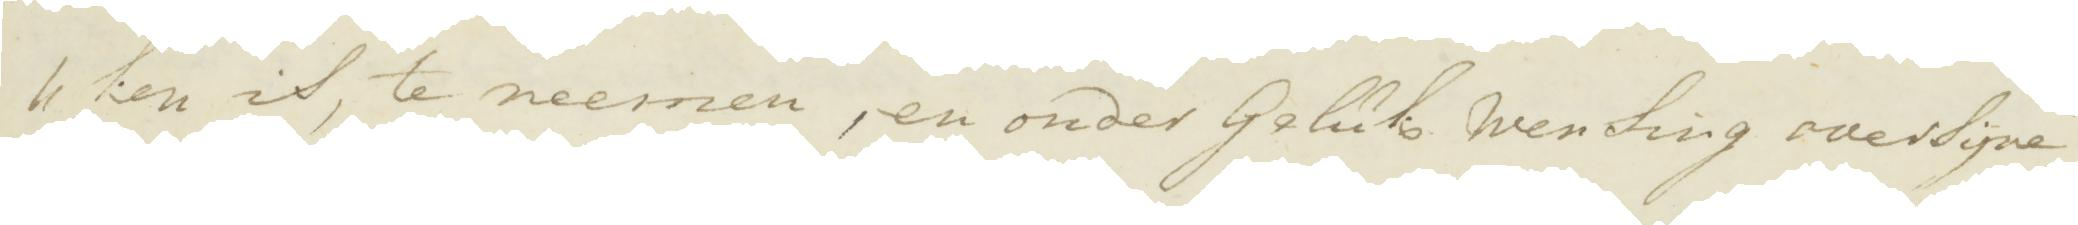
„ken is, te neemen, en onder geluk wensing over sijne
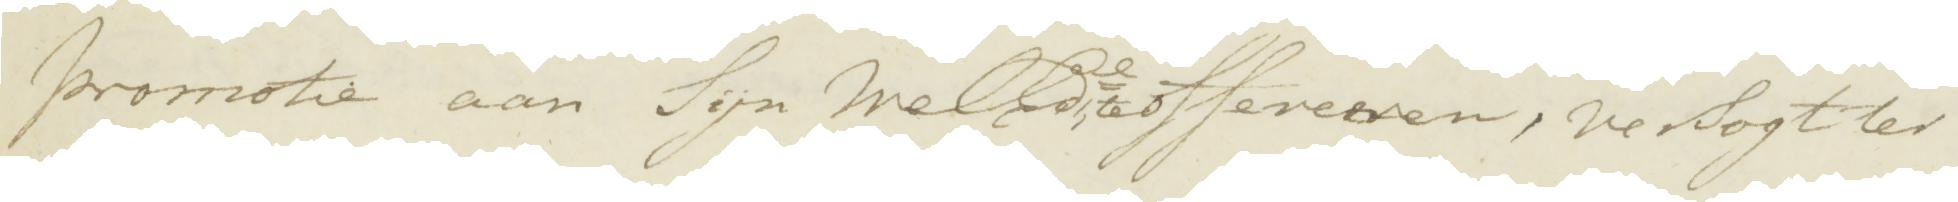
promotie aan sijn wel Ed=e te offereeren, versogt ter
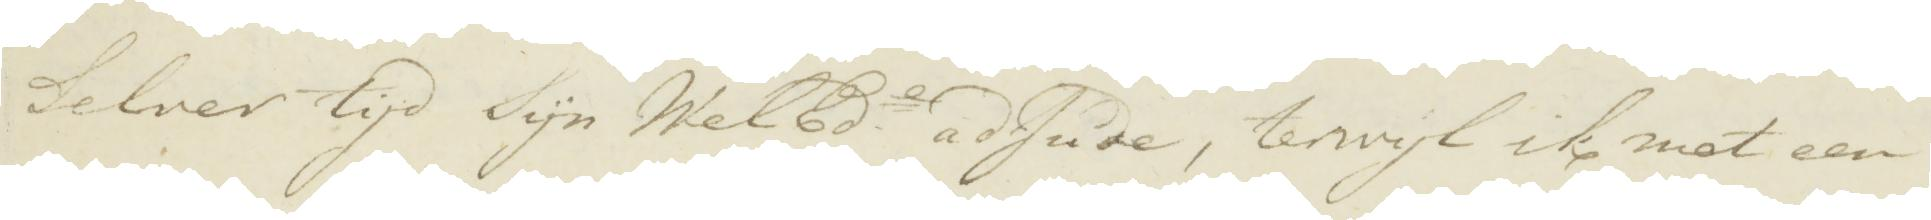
selver tijd sijn wel Ed:e adjude, terwyl ik met een
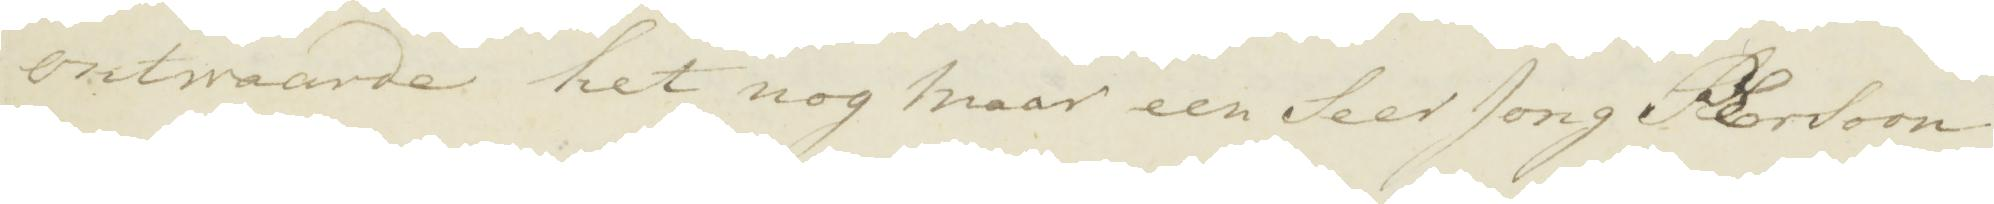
ontwaarde het nog maar een seer jong Persoon
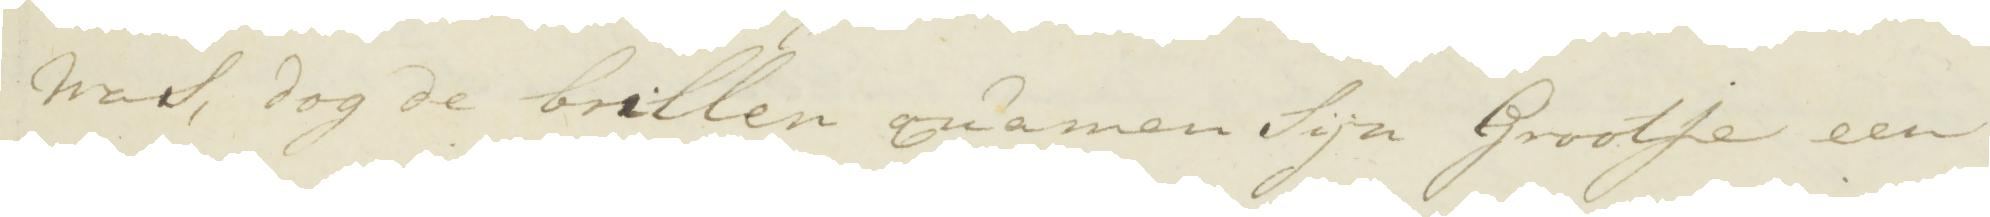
was, dog de brillen quamen sijn grootje een
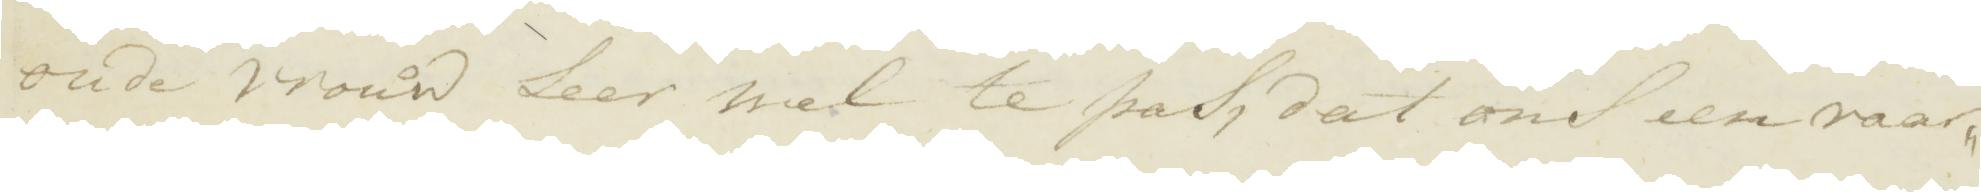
oude vrouw seer wel te pas, dat ons een vaar„
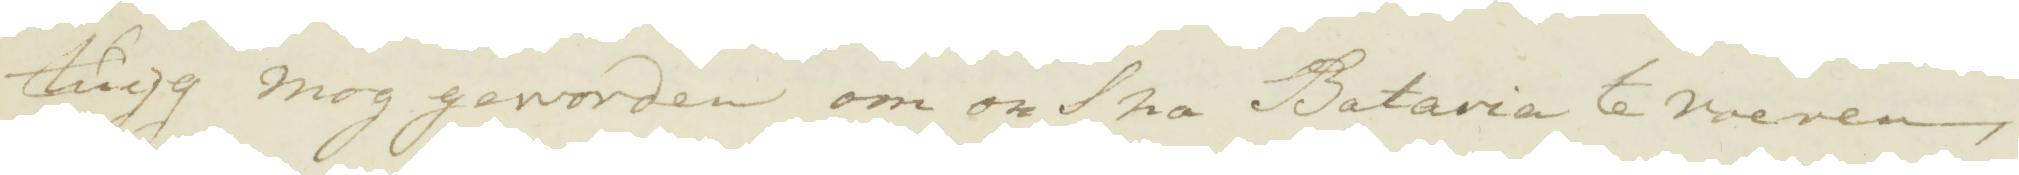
tuijg mog geworden om ons na Batavia te voeren,
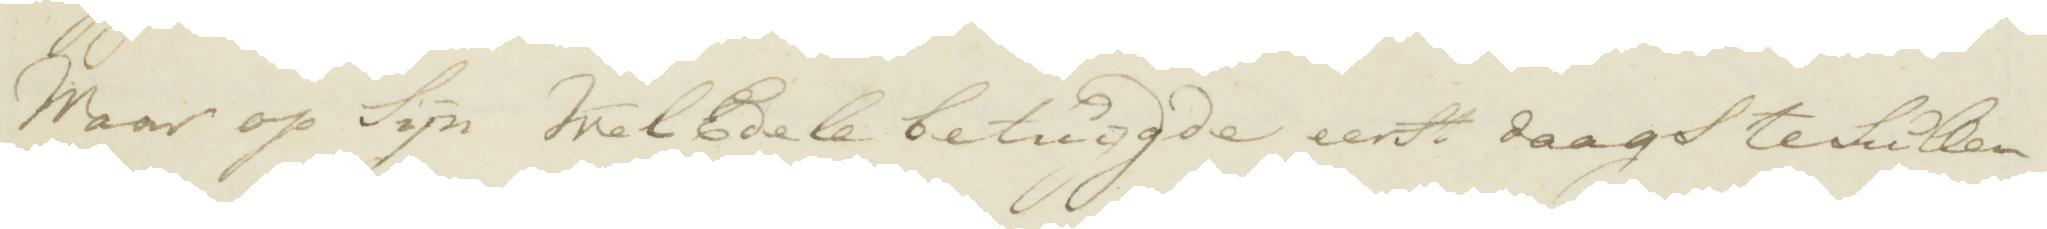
Waar op sijn Wel Edele betuijgde eerst daags te sullen
